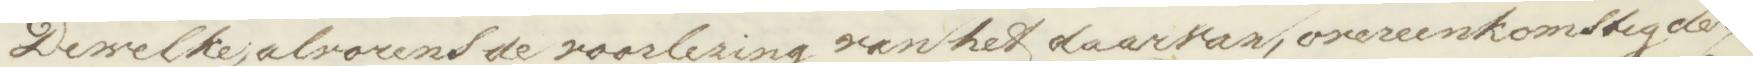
Dewelke, alvorens de voorlezing van het daarvan, overeenkomstig der
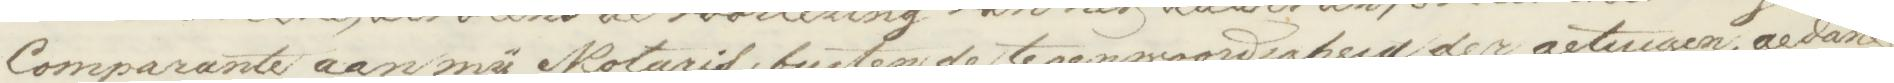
Comparante aan mij Notaris, buiten de tegenwoordigheid der getuigen, gedane
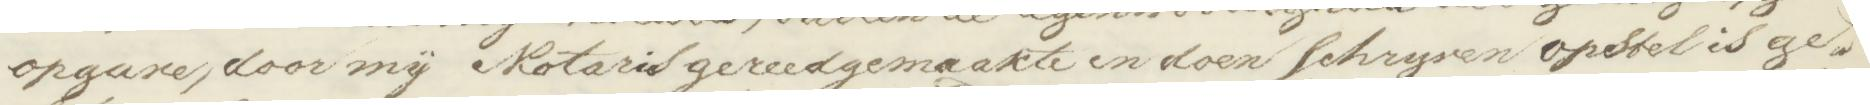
opgave, door mij Notaris gereedgemaakte en doen schrjven opstel is ge„
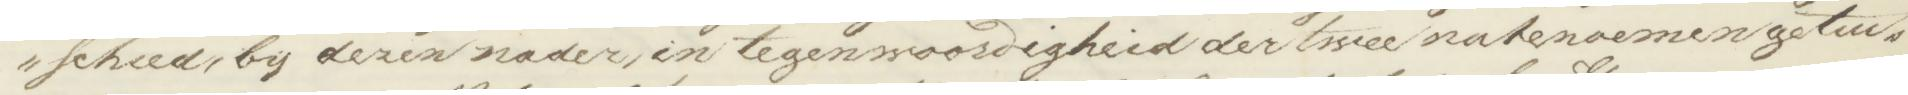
„schied, bij dezen nader, in tegenwoordigheid der twee natenoemen getui„
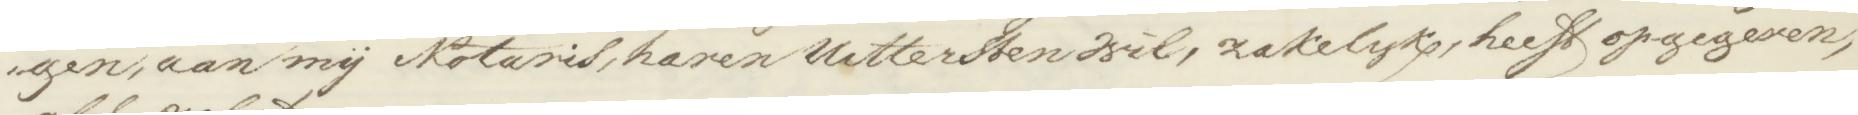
„gen, aan mij Notaris, haren Uittersten Wil, zakeljk, heeft opgegeven,
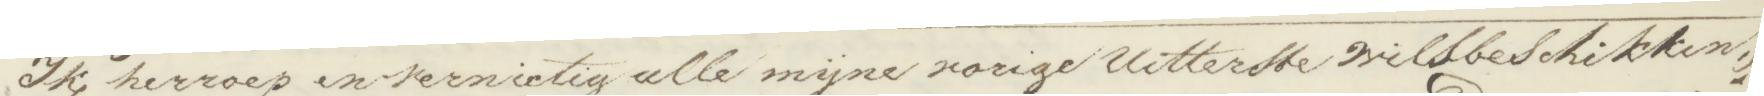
Ik herroep en vernietig alle mijne vorige Uitterste Wils beschikkin„
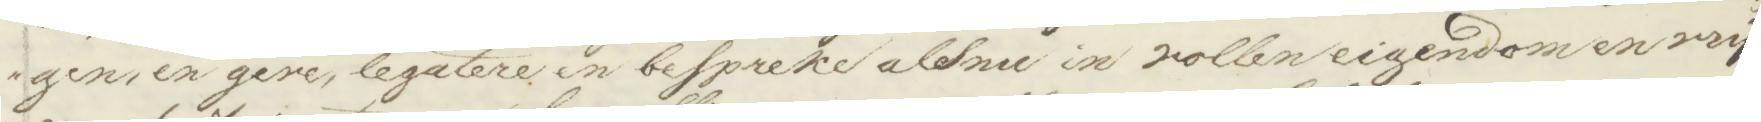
„gen, en geve, legatere en bespreke als nu in vollen eigendom en vrij
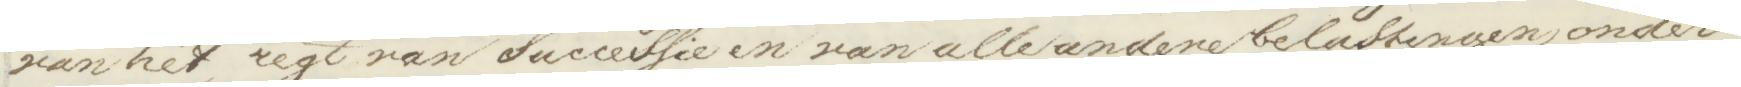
van het regt van successie en van alle andere belastingen, onder
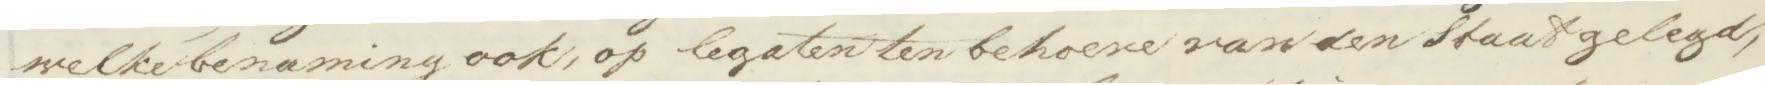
welke benaming ook, op legaten ten behoeve van den staat gelegd,
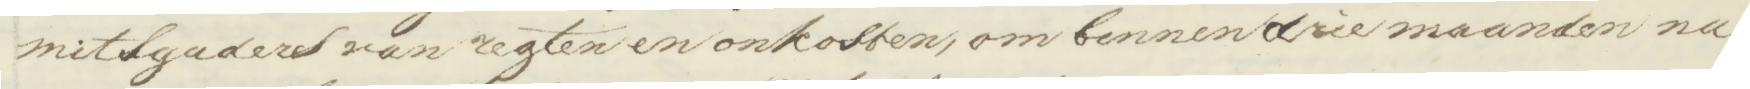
mitsgaders van regten en onkosten, om binnen drie maanden na
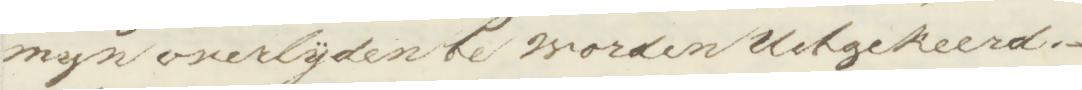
mijn overlijden te worden uitgekeerd.-
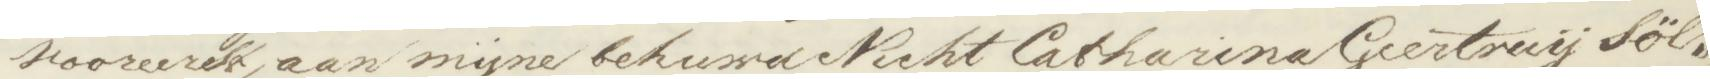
Vooreerst, aan mijne behuwd Nicht Catharina Geertruij Söl
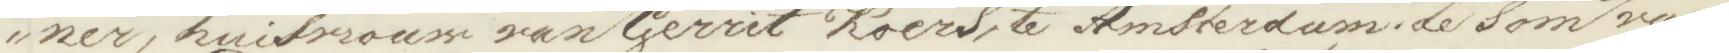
„ner, huisvrouw van Gerrit Koers, te Amsterdam, de som van
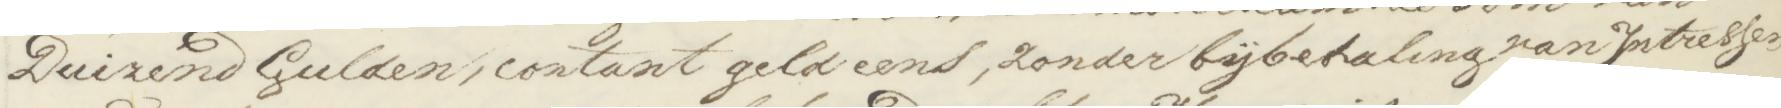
Duizend Gulden, contant geld eens, zonder bijbetaling van Jntressen
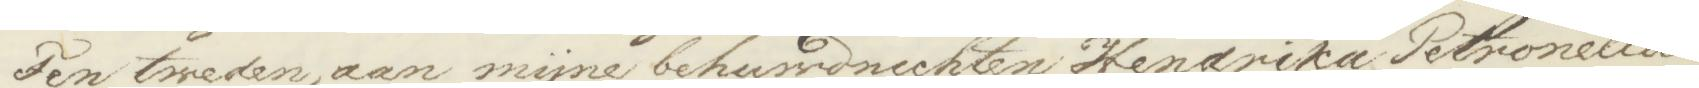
Ten tweden, aan mijne behuwdnichten Hendrika Petronella
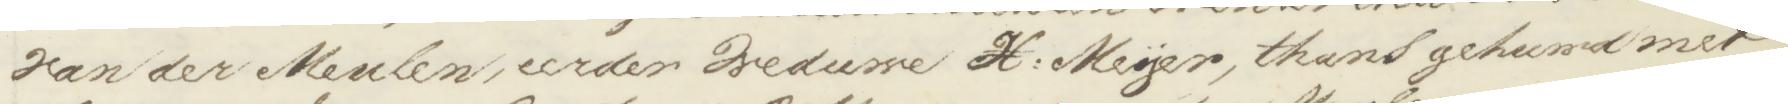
van der Meulen, eerder weduwe H: Meijer, thans gehuwd met
